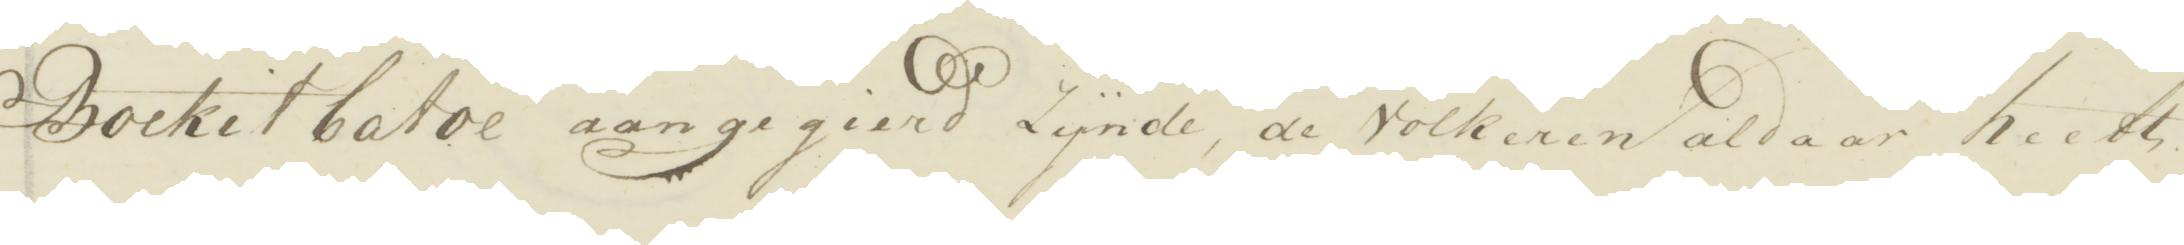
Boekit batoe aangegierd zijnde, de volkeren aldaar heeft
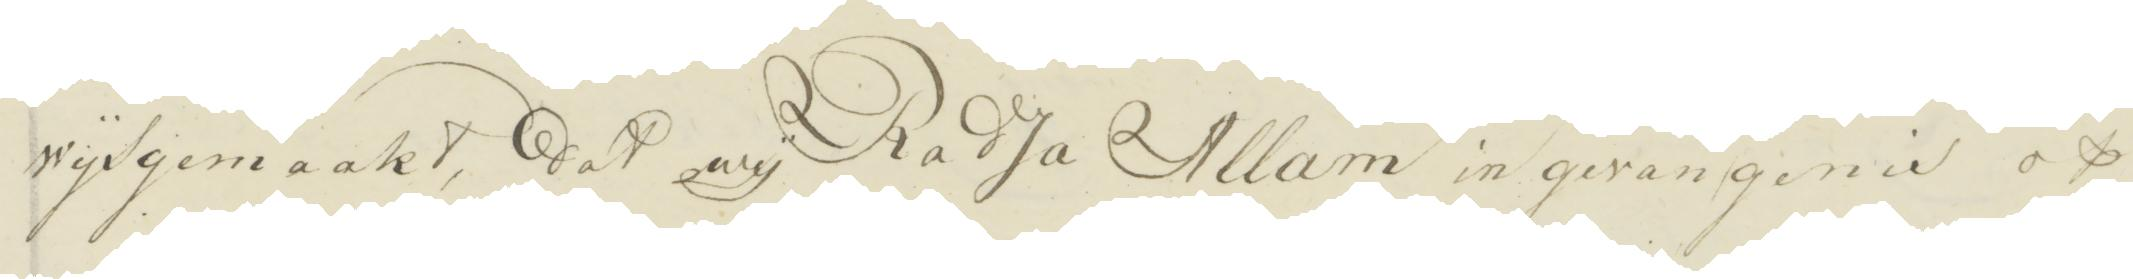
wijsgemaakt, dat wij Radja Allam in gevangenis op
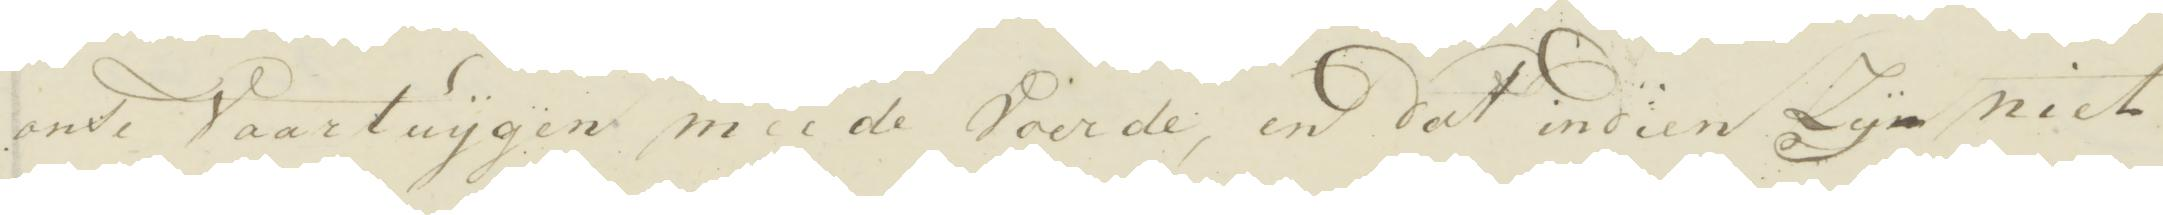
onse vaartuijgen meede voerde, en dat indien zij niet
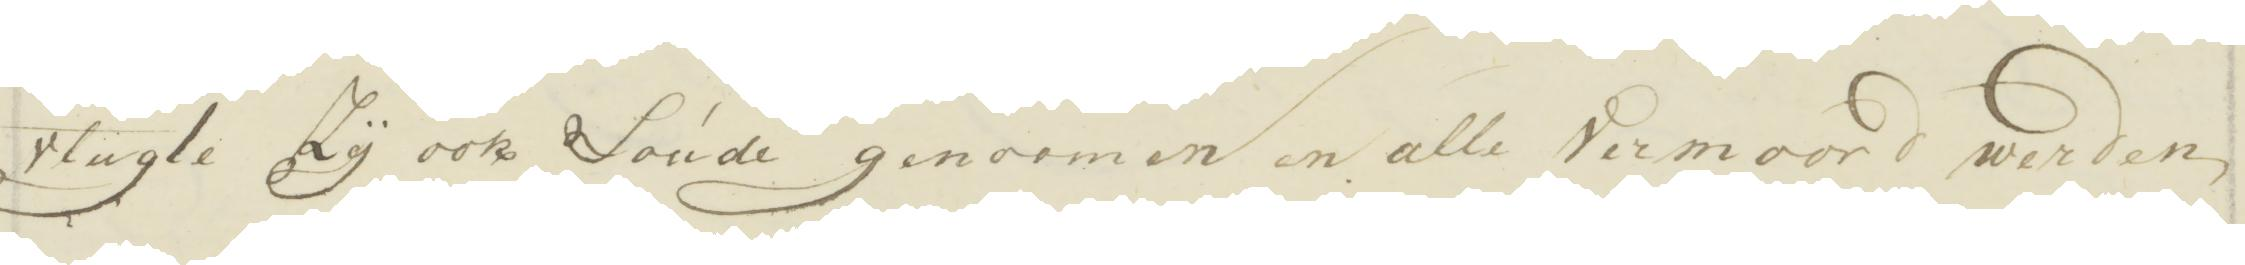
vlugte zij ook soude genoomen en alle vermoord werden,
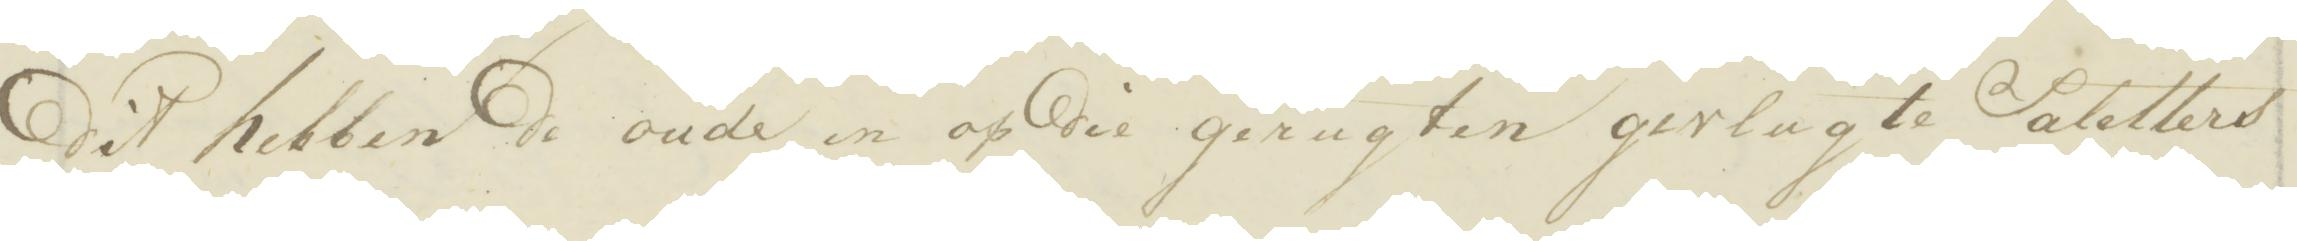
dit hebben de oude en op die gerugten gevlugte saletters
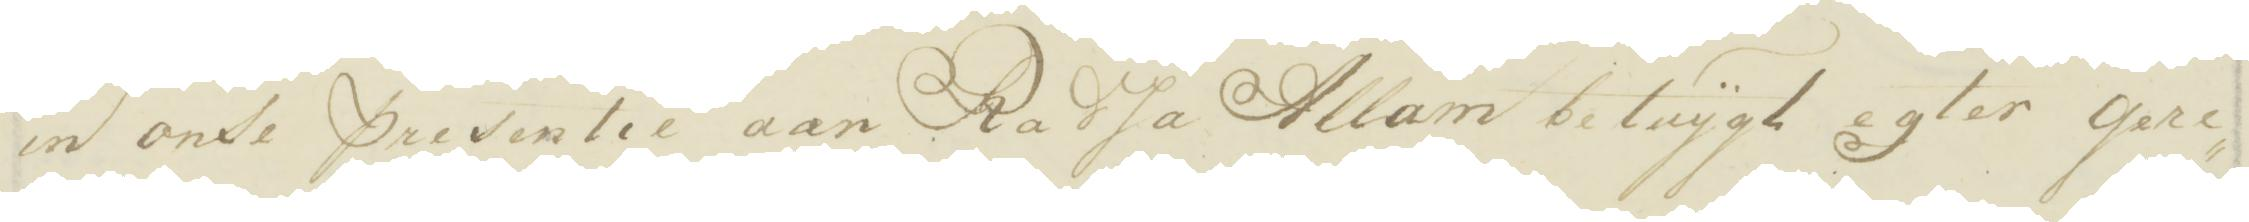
in onse Presentie aan Radja Allam betuijgt egter gere„
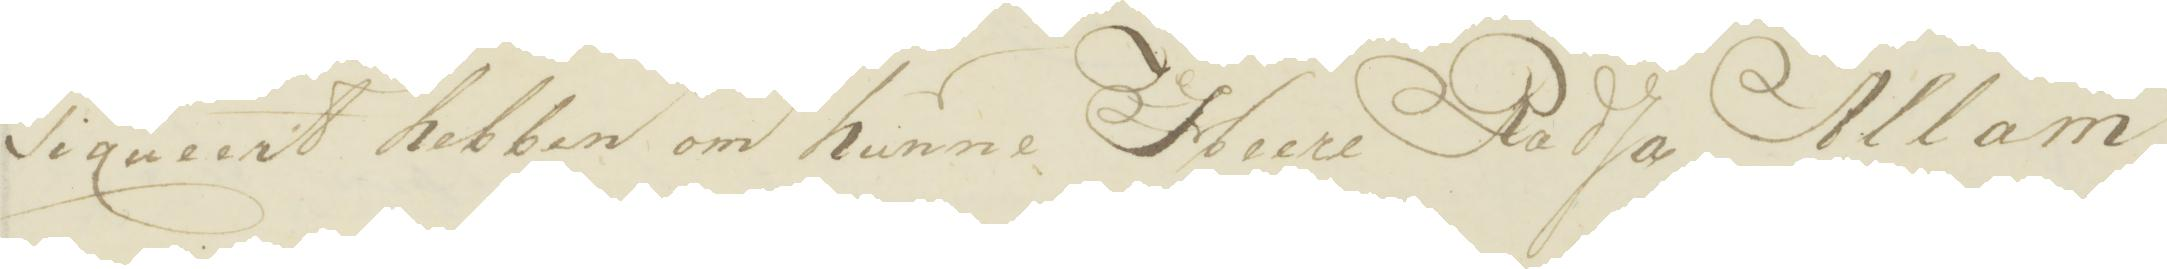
siqueert hebben om hunne Heere Radja Allam
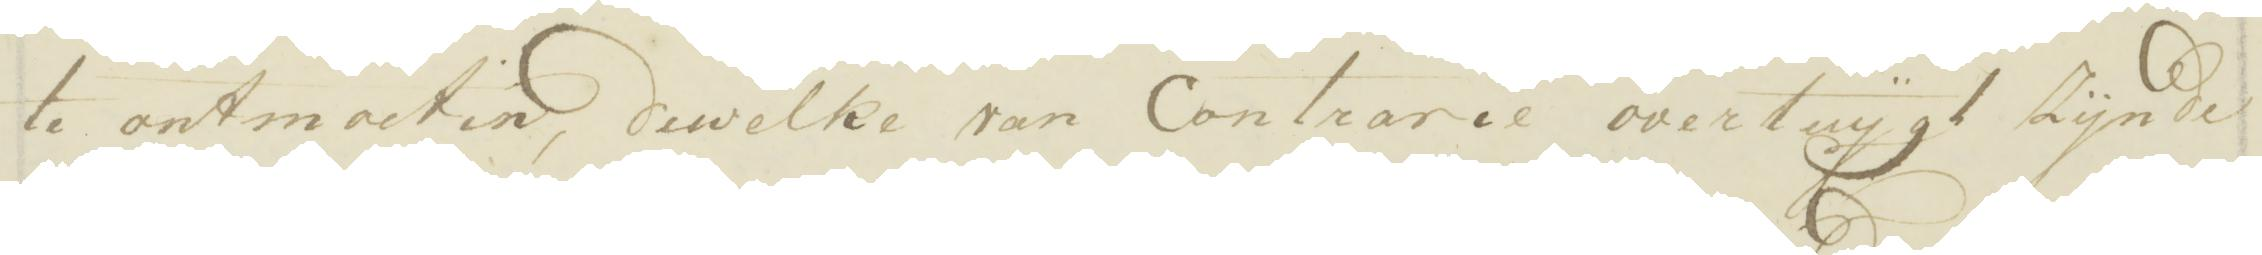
te ontmoeten, dewelke van contrarie overtuijgt zijnde
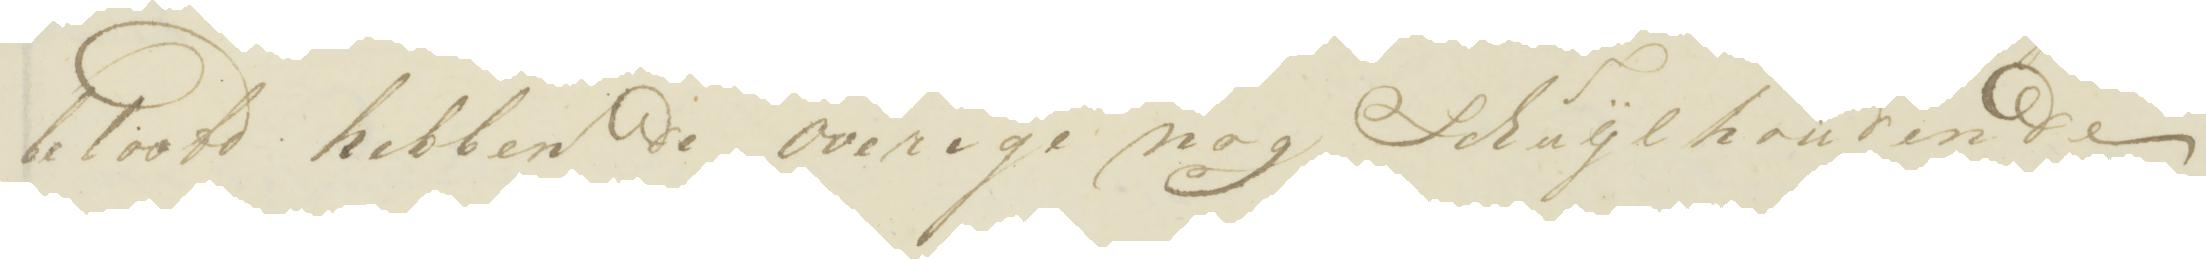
beloofd hebben de overige nog schuijlhoudende
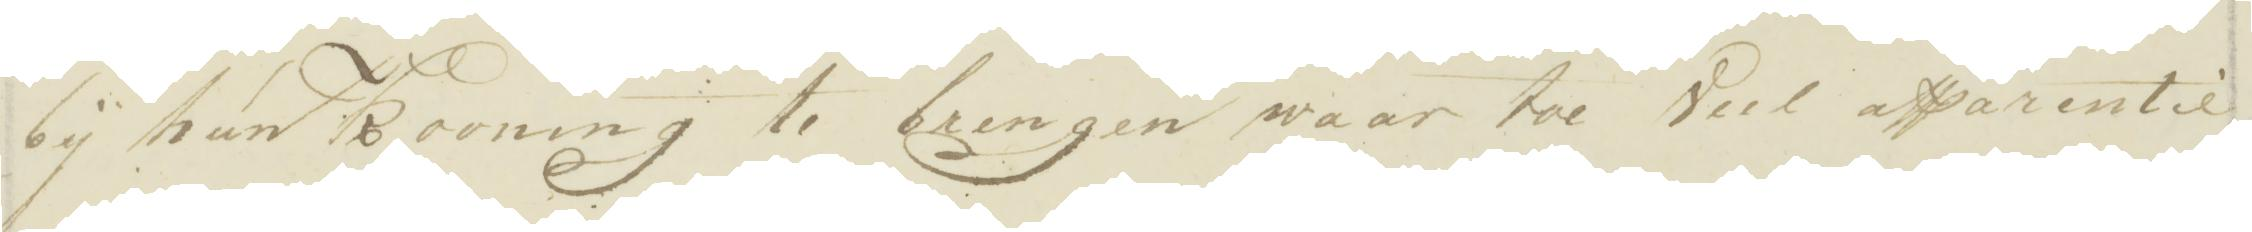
bij hun Kooning te brengen waar toe veel apparentie
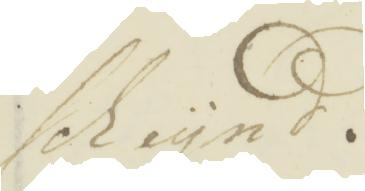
scheijnd.
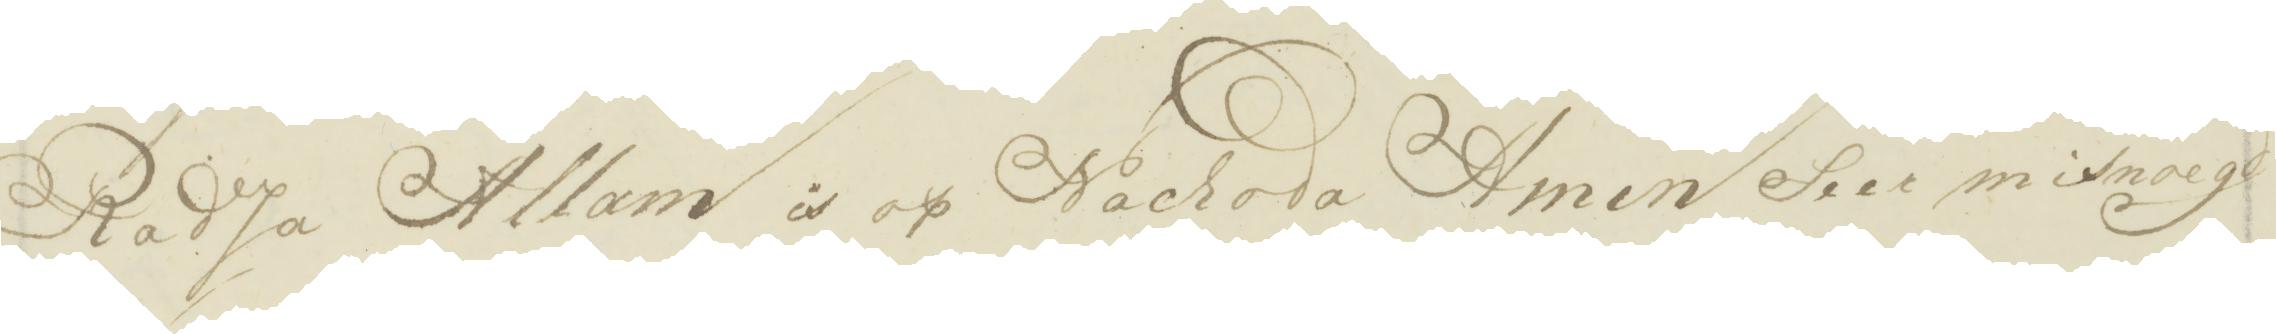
Radja Allam is op Nachoda Amin seer misnoegd
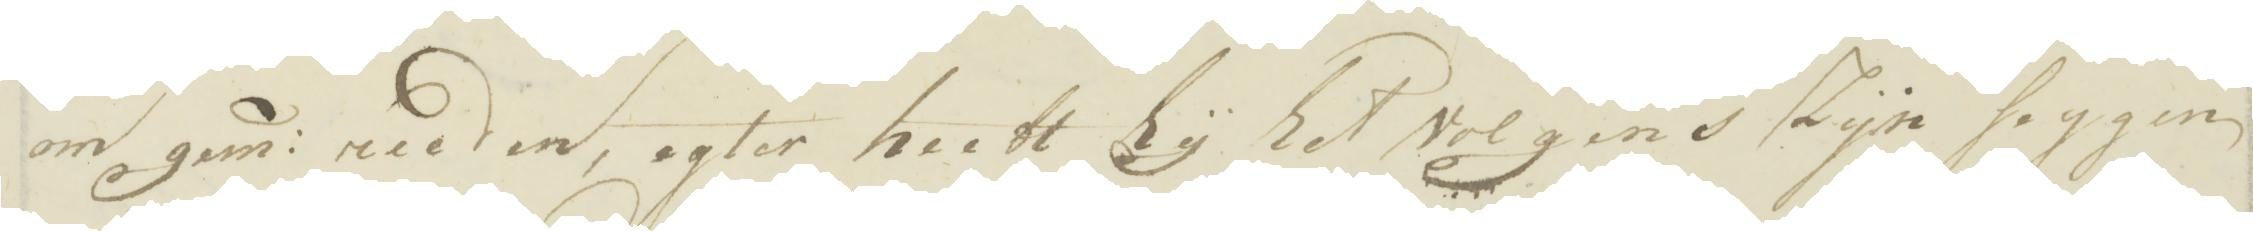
om gem: reeden, egter heeft hij het volgens zijn seggen
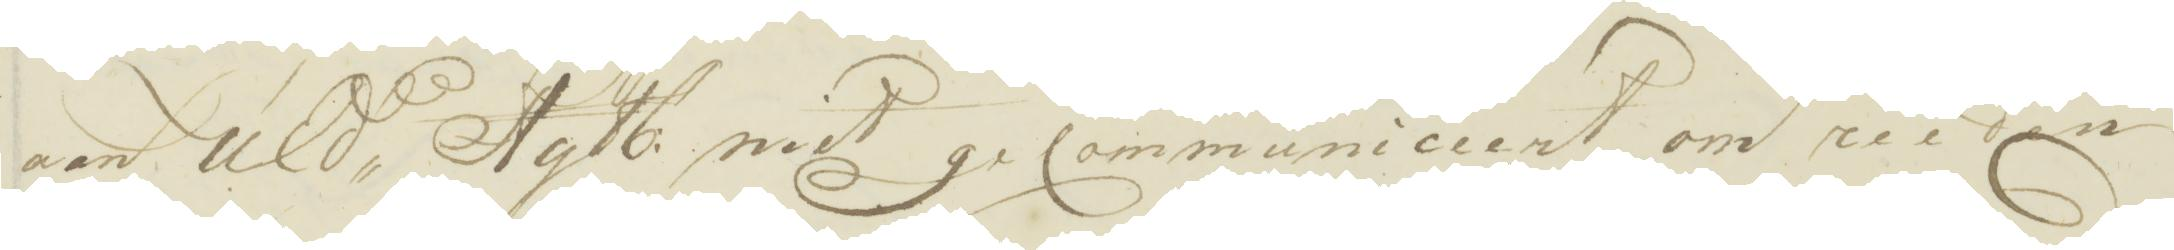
aan uEd„ Agtb: niet gecommuniceert om reeden
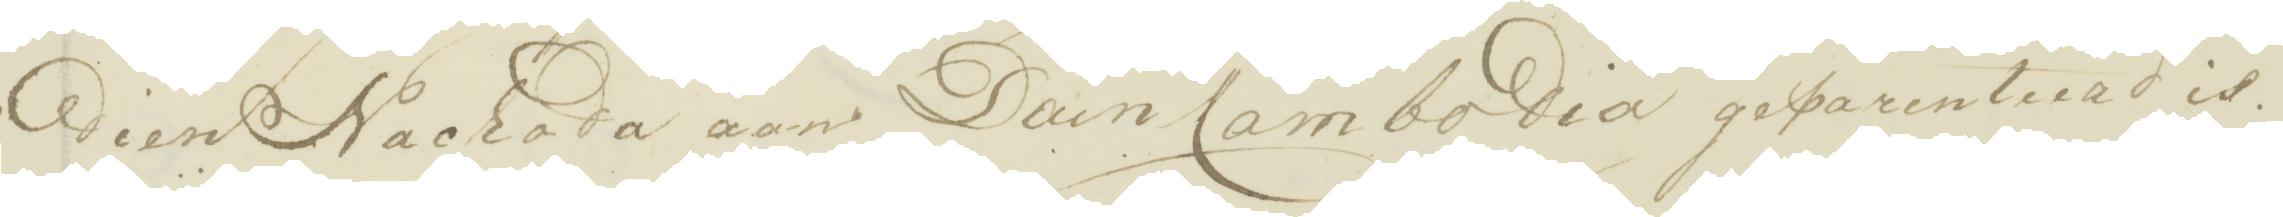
dien Nachoda aan Dain Cambodia geparenteerd is.
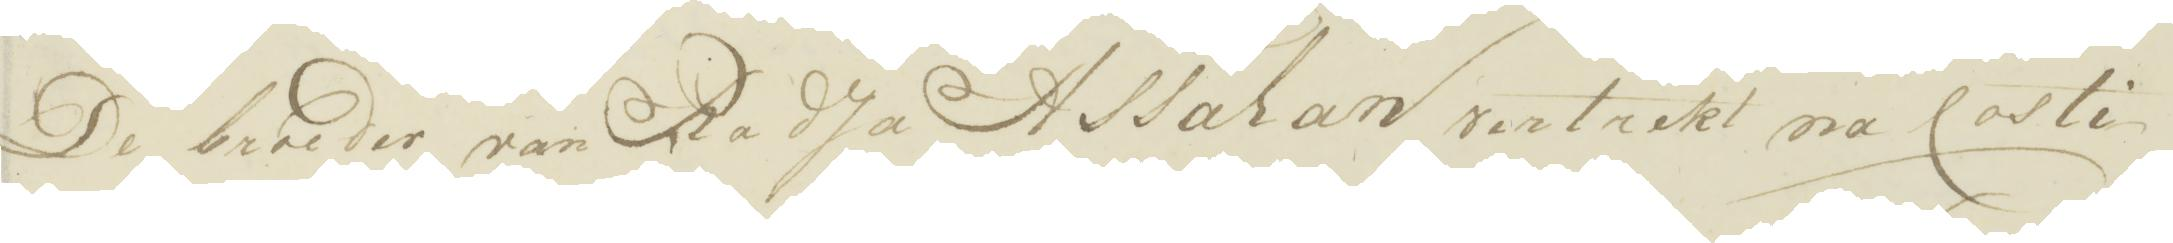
De broeder van Radja Assahan vertrekt na Costi
